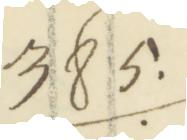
385.
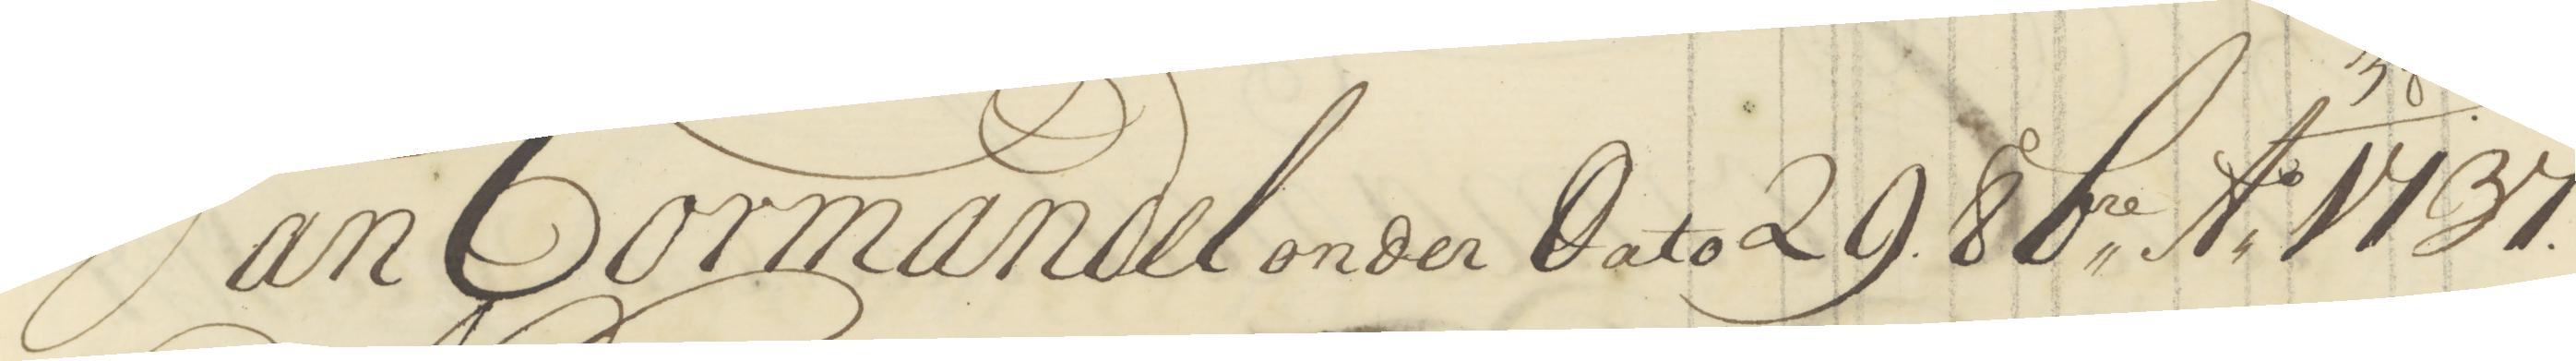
Van Cormandel onder dato 29. 8b„re A„o 1737.
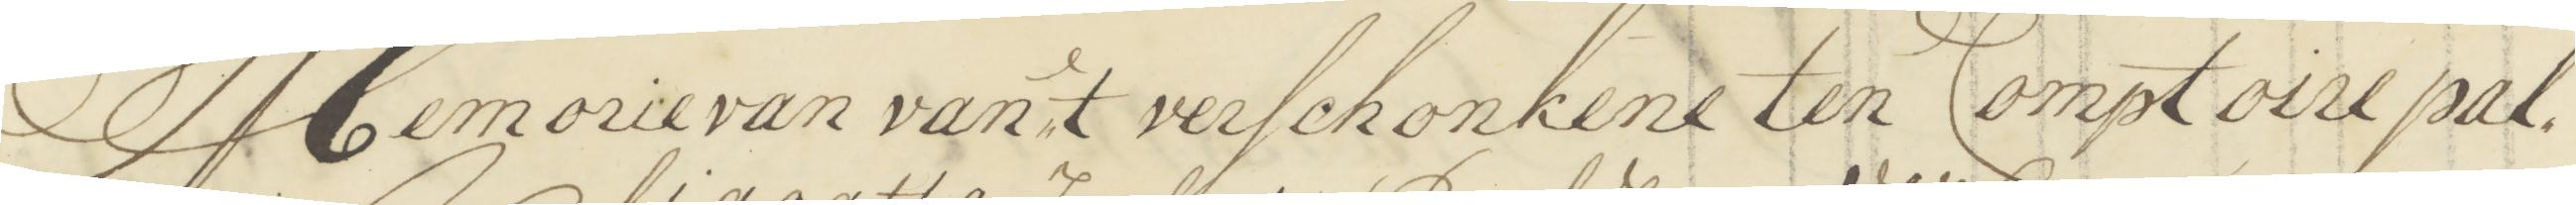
Memorie van van„'t verschonkene ten Comptoire pal„
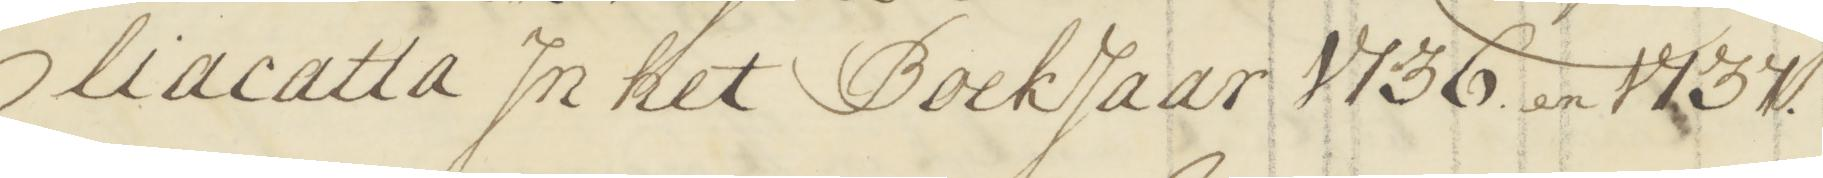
liacatta Jn het Boekjaar 1736. en 1737.
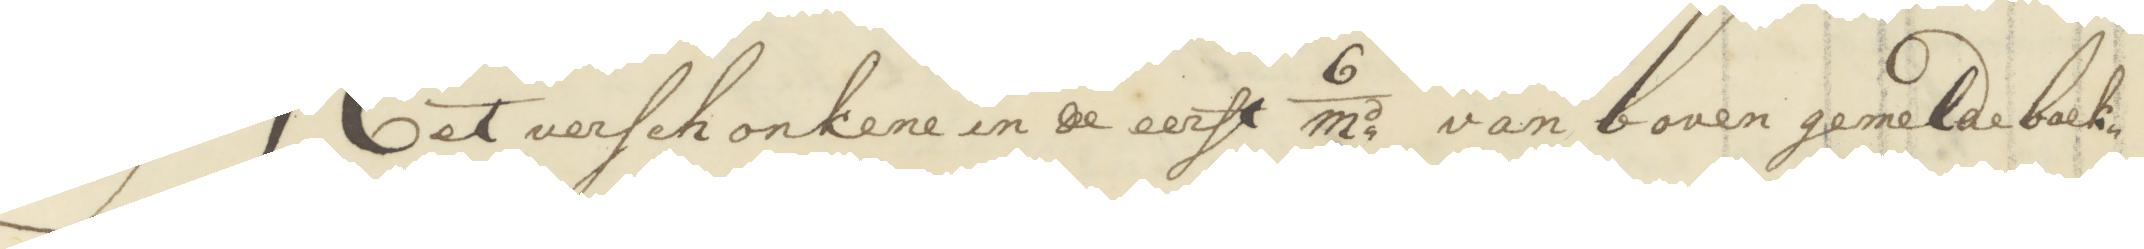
Het verschonkene in de eerst 6/m„d van boven gemelde boek„
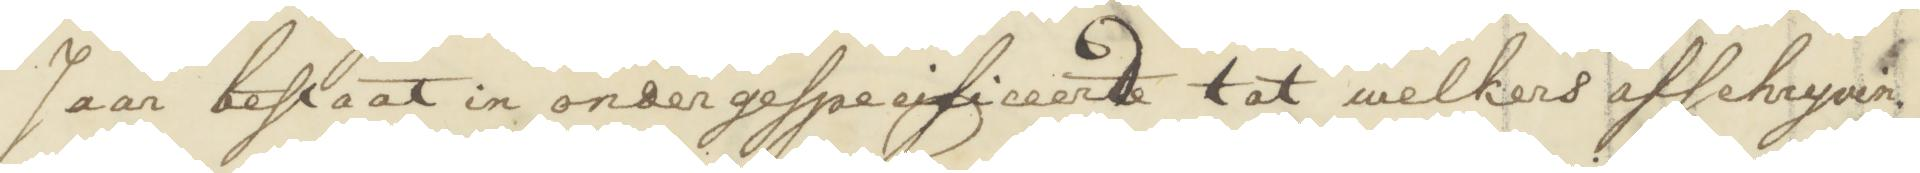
Jaar bestaat in onder gespecificeerde tot welkers afschryvin„
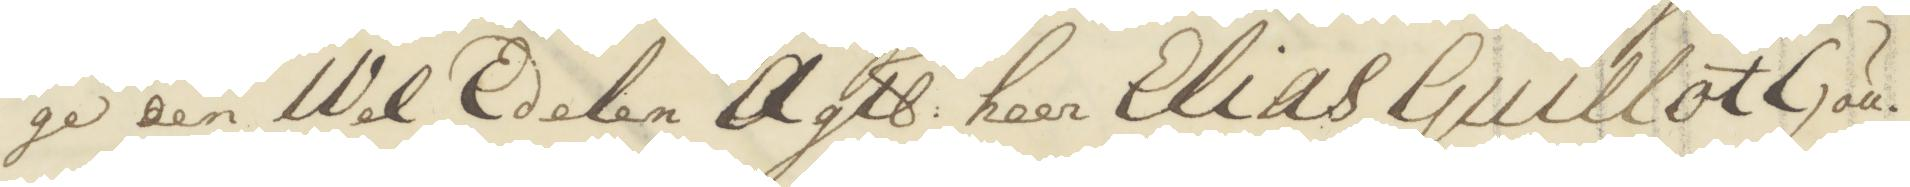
ge den Wel Edelen Agtb: heer Elias Guillot Gou„
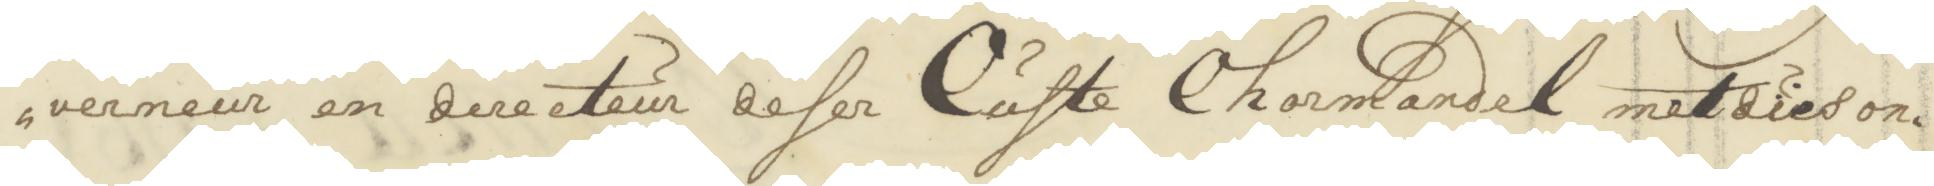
„verneur en directeur deser Custe Chormandel met dies on„
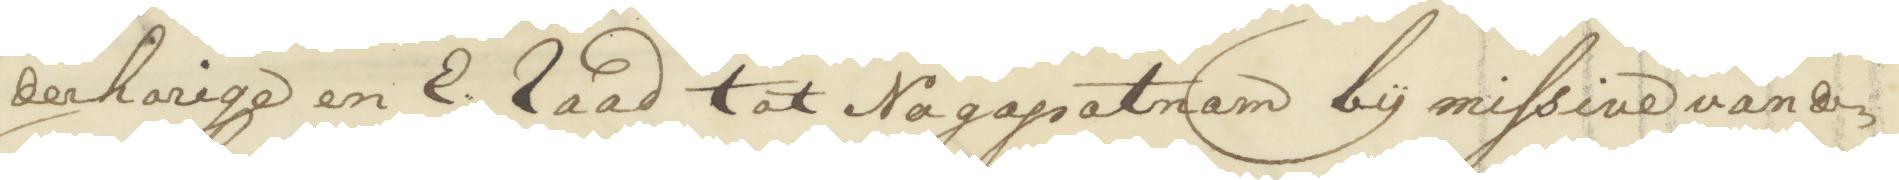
derhorige en E. raad tot Nagapatnam bij missive van den
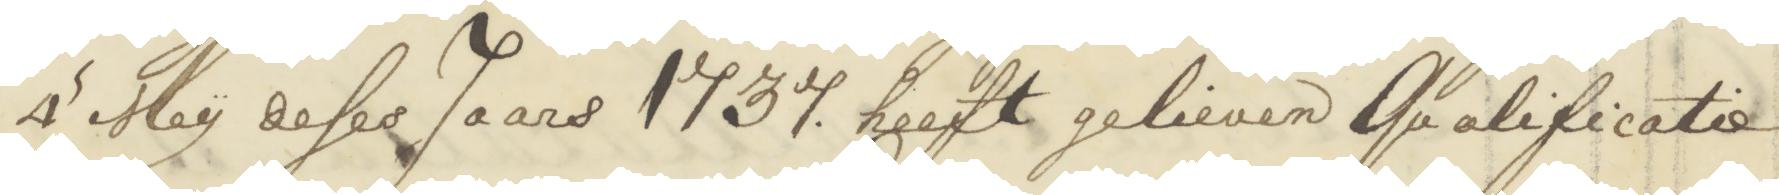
4' Maij deses Jaars 1737. heeft gelieven Qualificatie
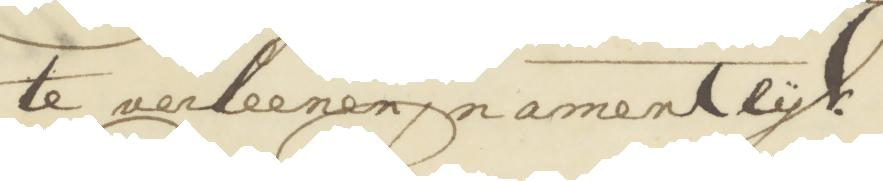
te verleenen, namentlijk
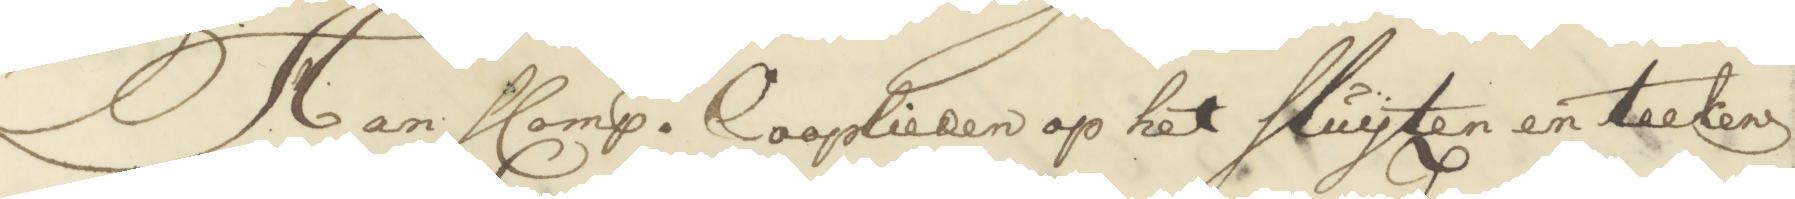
Aan sComp.s Cooplieden op het sluijten en teekenen
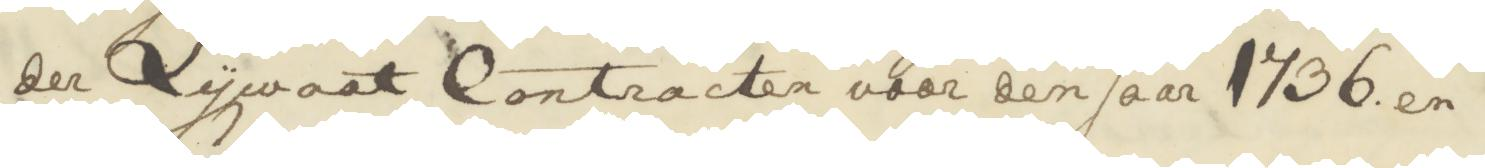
der Lijwaat Contracten voor den Jaar 1736. en
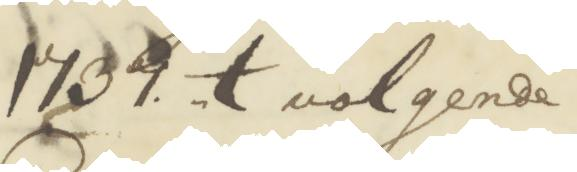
1737. 't volgende
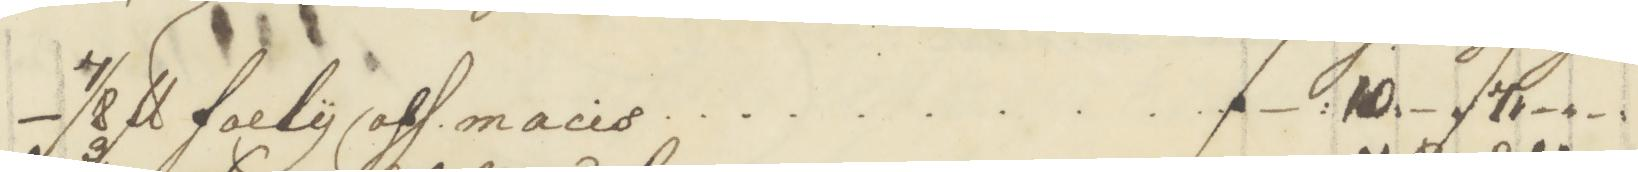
—7/8 lb foelij off macis . . . . . . . . . . . ƒ —: 10: — ƒ 7„ — „ —
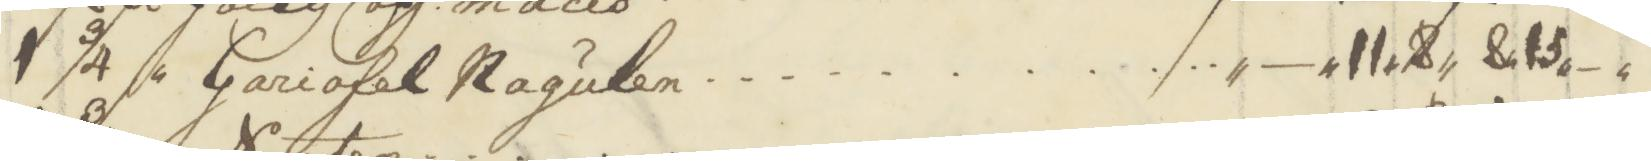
1 ¾ „ Gariofel Nagulen - - - - - . . . . . . „ —„ 11„ 8„ 8„ 15„ —„
